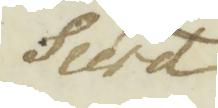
seerd
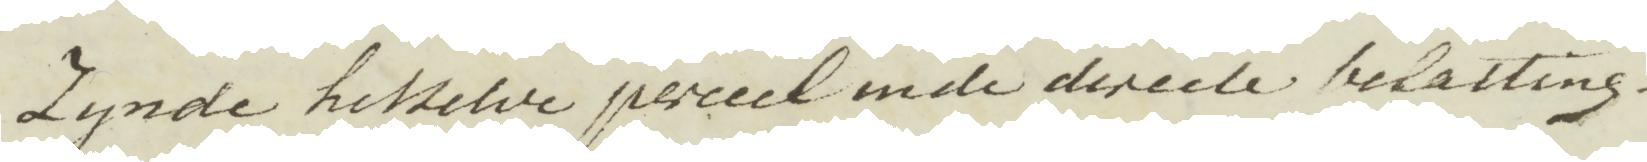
Zynde helzelve perceel in de directe belasting
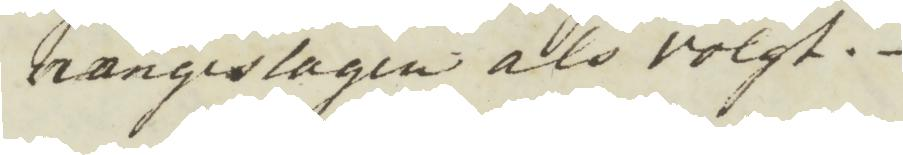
aangeslagen als volgt.-
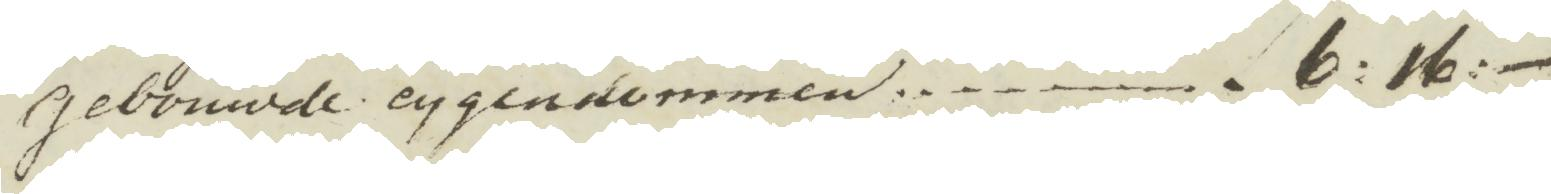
gebouwde eygendommen - - - - - - - - - ƒ 6: 16:—
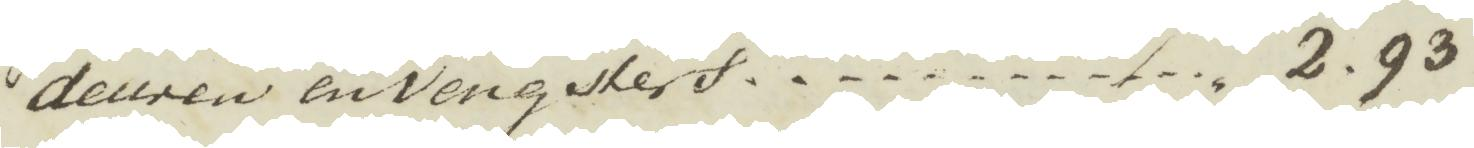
deuren en vengsters - - - - - - - - - - - „ 2. 93
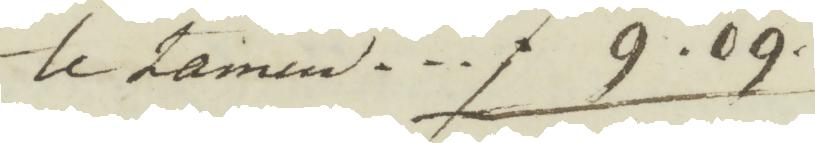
te zamen - - - ƒ 9 .09.
